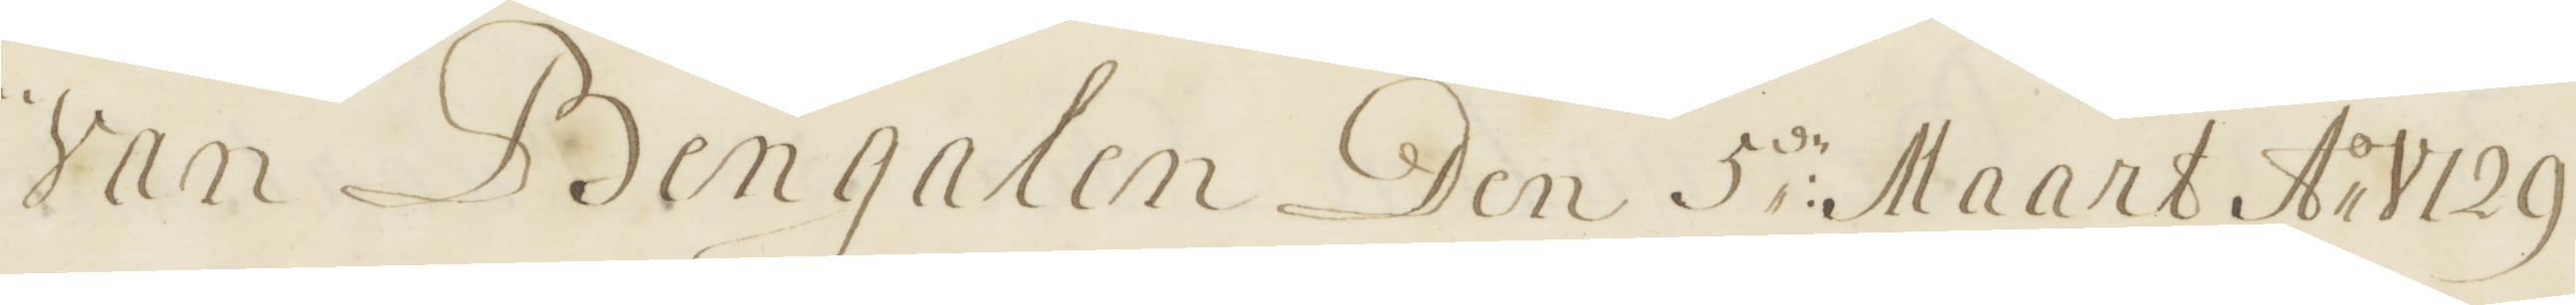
Van Bengalen Den 5„en Maart A„o 1729
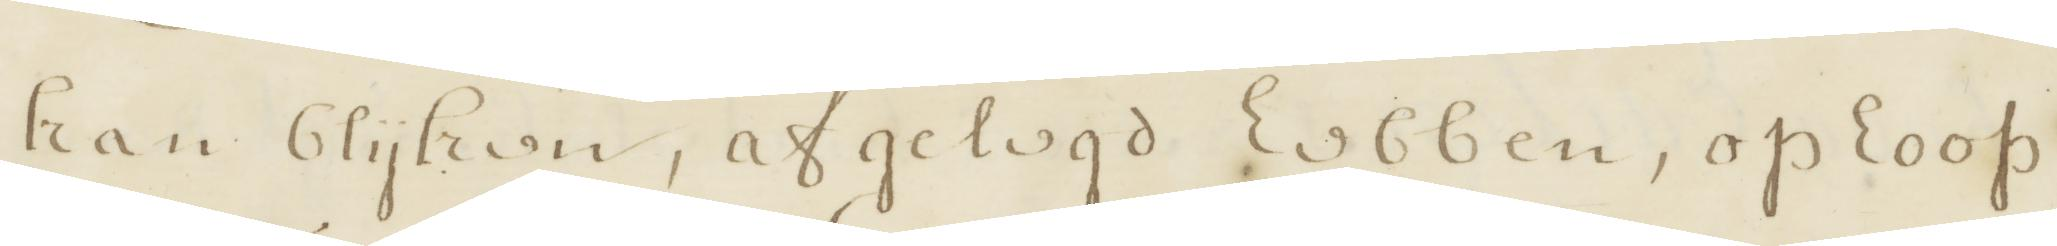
kan blijken, afgelegd hebben, op hoop
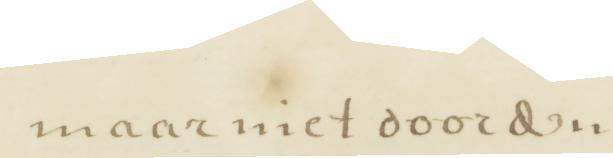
maar niet door den
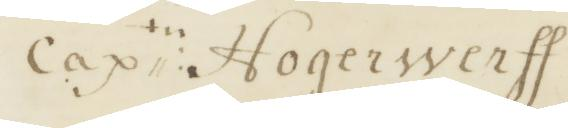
Cap„tn: Hogerwerff
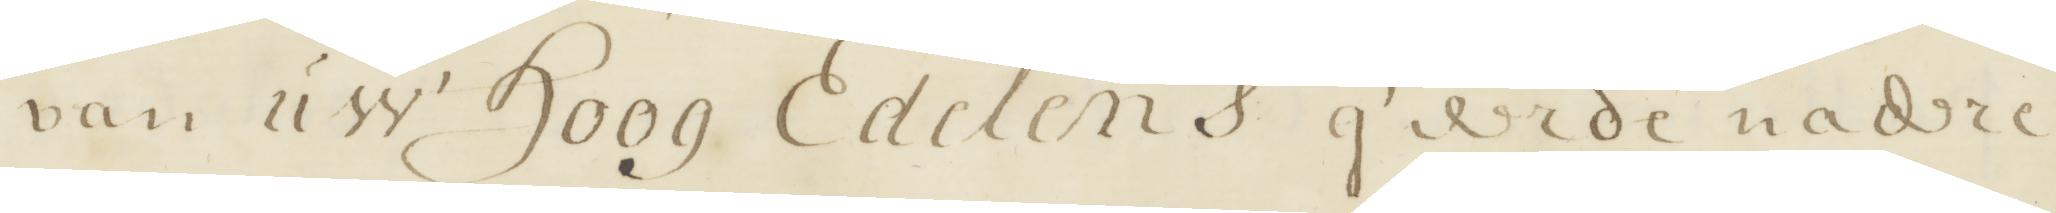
van uw Hoog Edelens g’eerde nadere
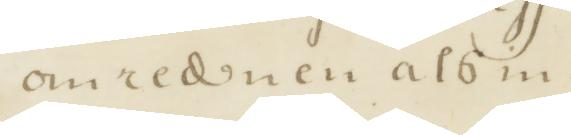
om redenen als in
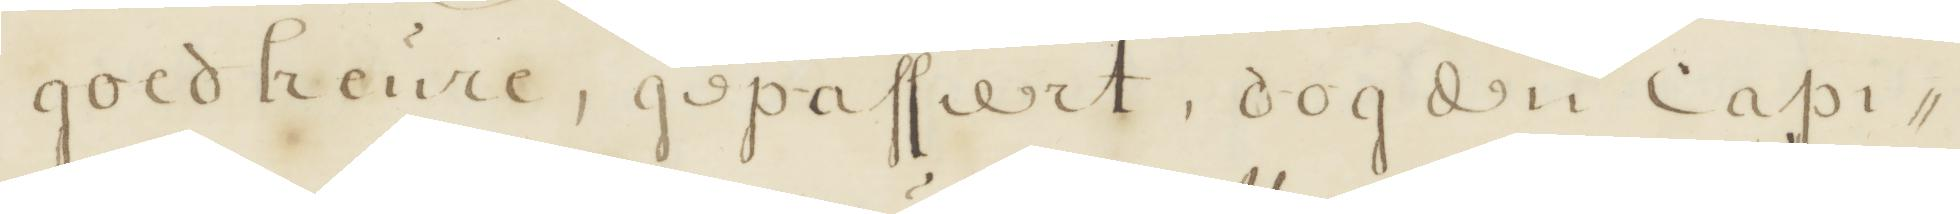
goedkeure, gepasseert, dog den Capi„
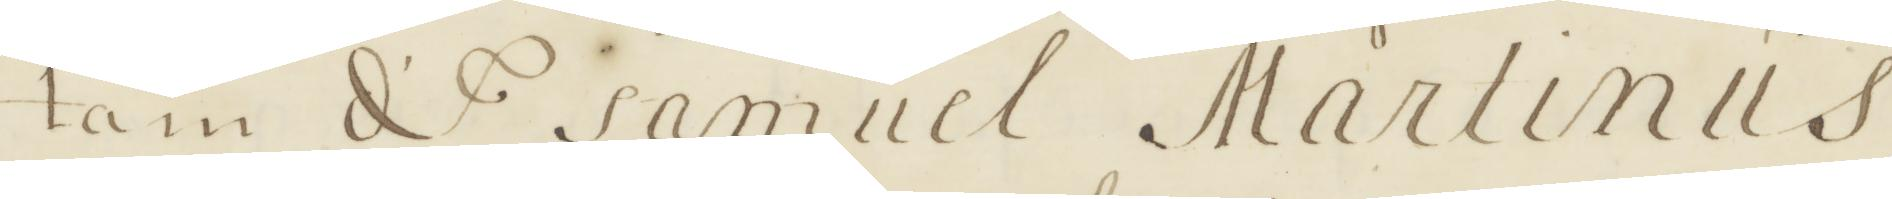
tain d'E samuel Martinus
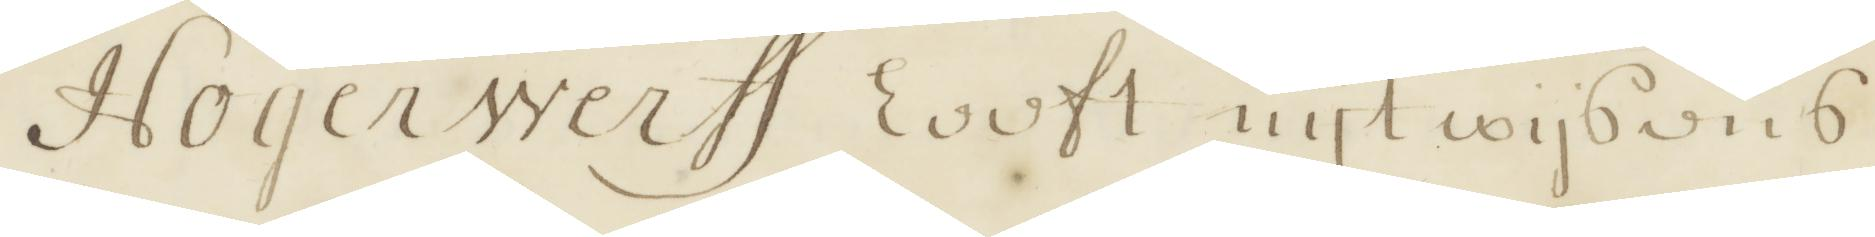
Hogerwerff heeft uijt wijsens
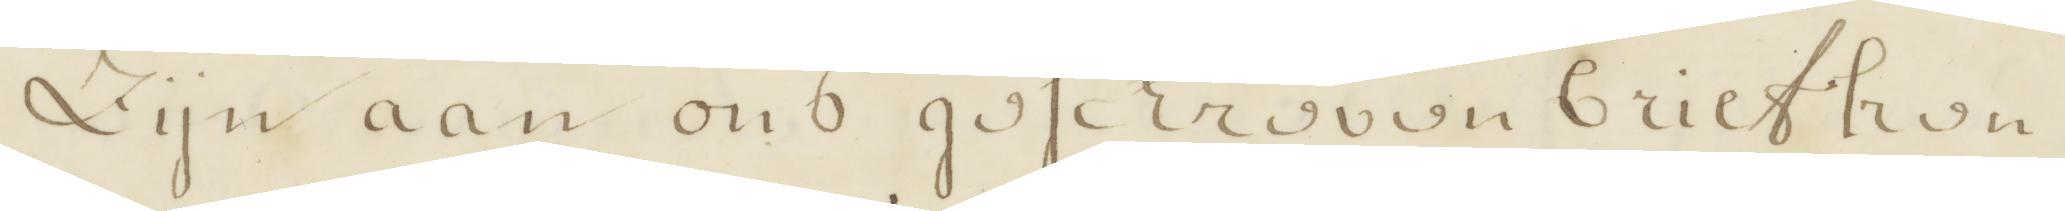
zijn aan ons geschreven briefken
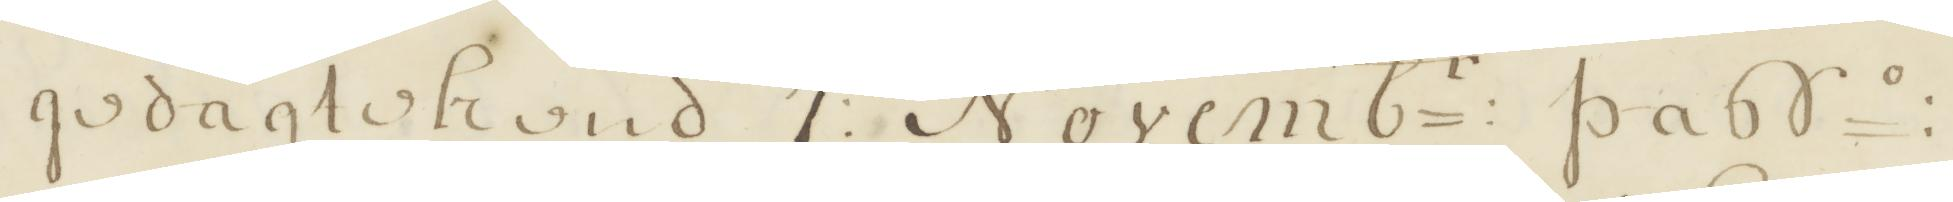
gedagtekend 7:' Novemb=r: pass=o:
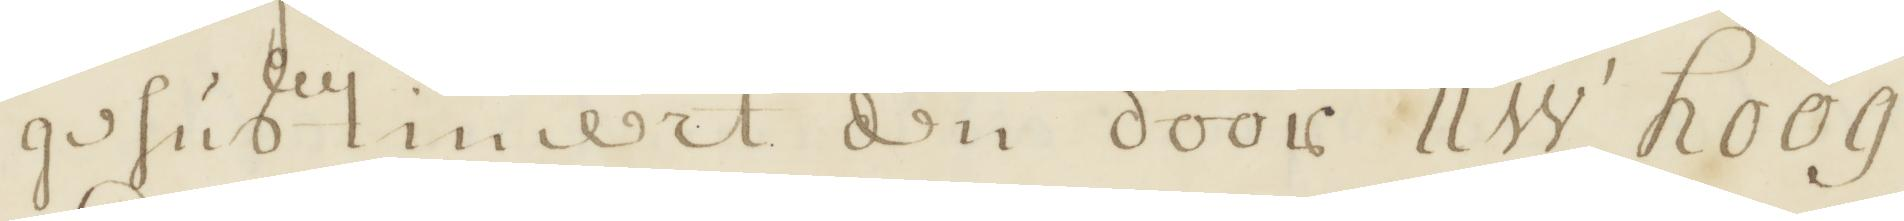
gesustineert den door uw hoog
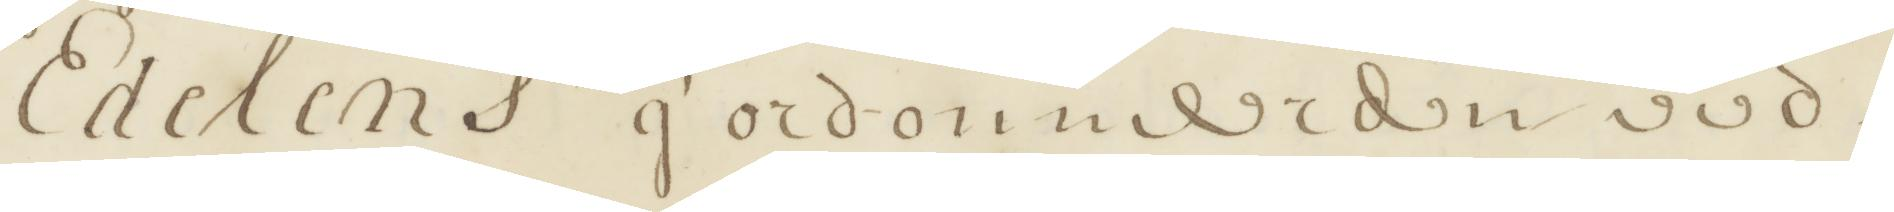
Edelens g’ordonneerden eed
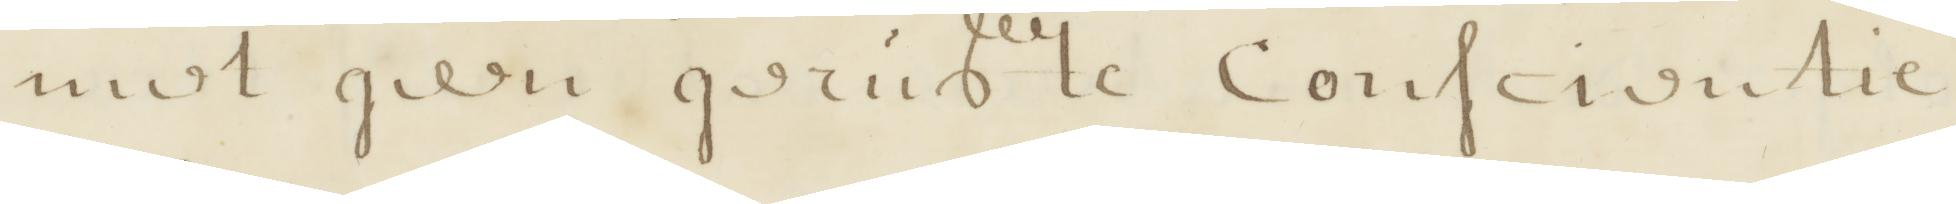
met geen geruste conscientie
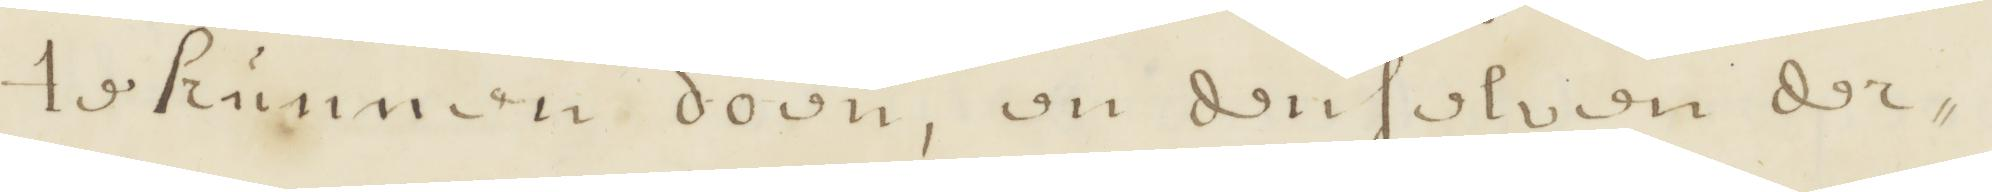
te kunnen doen, en denselven der„
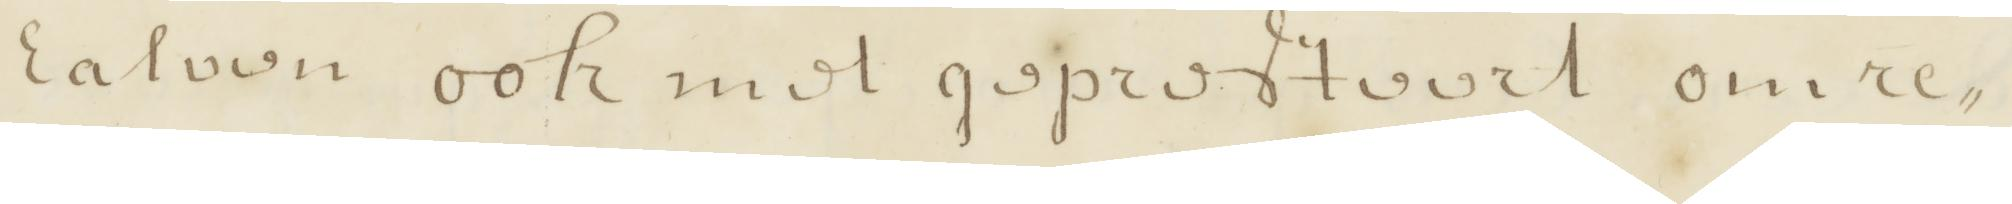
halven ook niet gepresteert om re„
